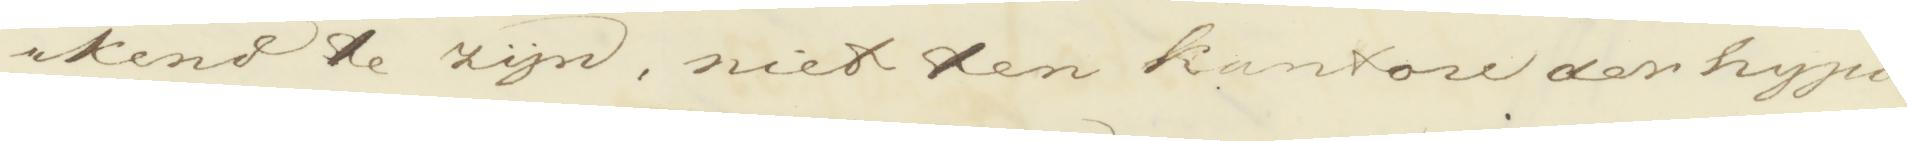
kend te zijn, niet ten kantore der hypo
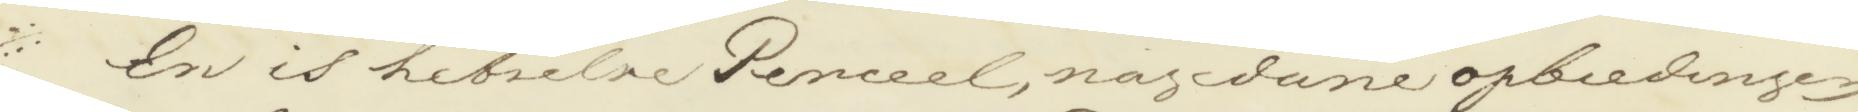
En is hetzelve Perceel, nagedane opbiedingen
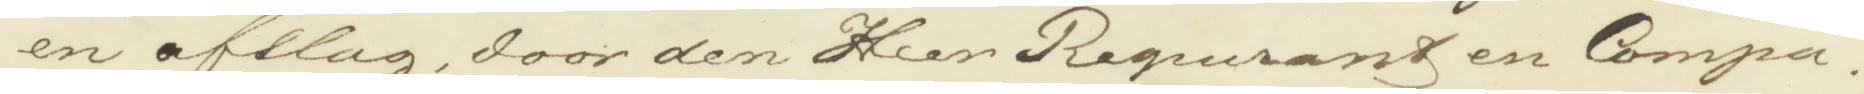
en afslag, door den Heer Requirant en Compa.
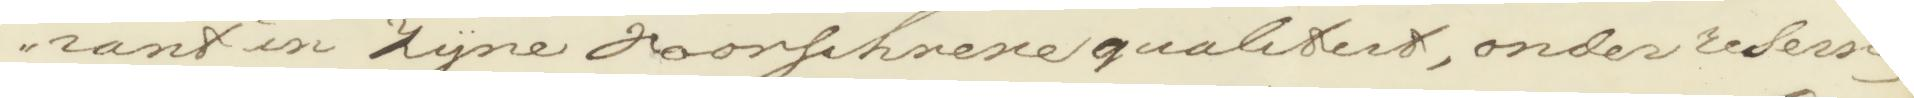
„rant en zijne voorschreve qualiteit, onder reserven
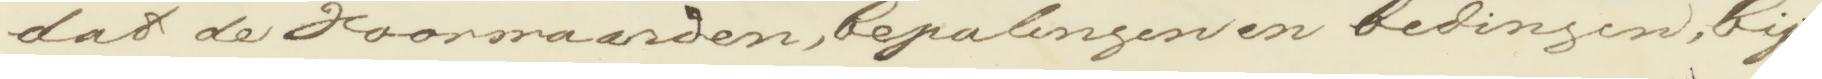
dat de voorwaarden, bepalingen en bedingen, bij
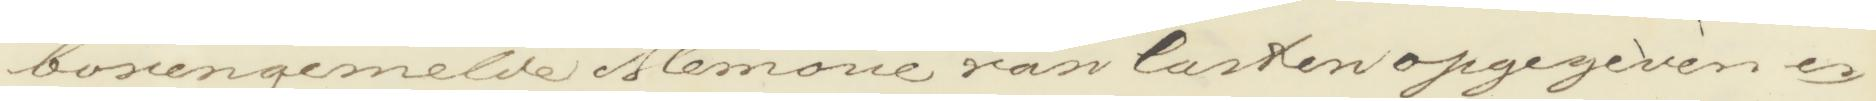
bovengemelde Memorie van lasten opgegeven en
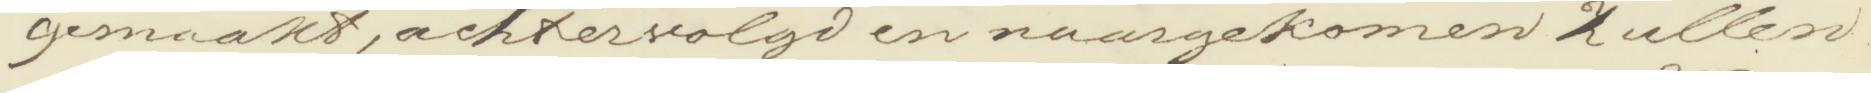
gemaakt, achtervolgd en naargekomen zullen
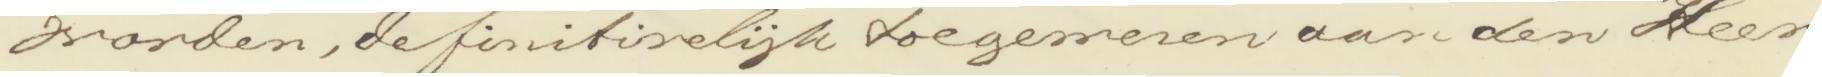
worden, definitivelijk toegewezen aan den Heer
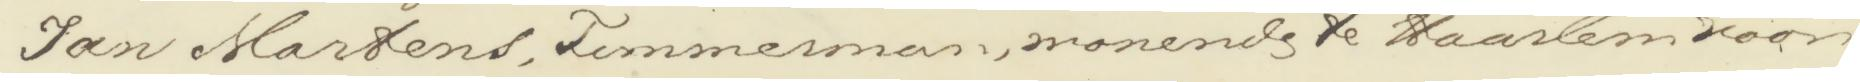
Jan Martens, Timmerman, wonenden te Haarlem voor
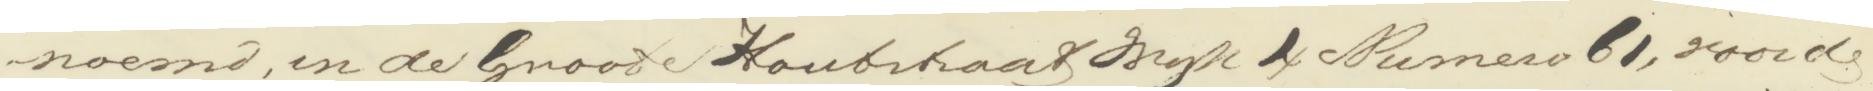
noemd, in de Groote Houtstraat Wyk 4 Numero 61, voor den
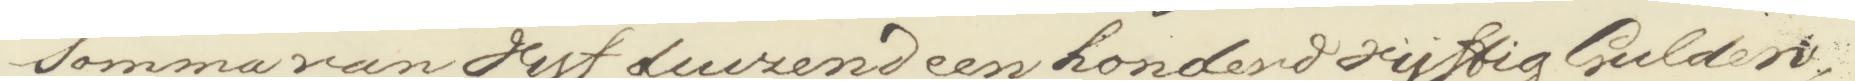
Somma van Vyf duizend een honderd vijftig Gulden,
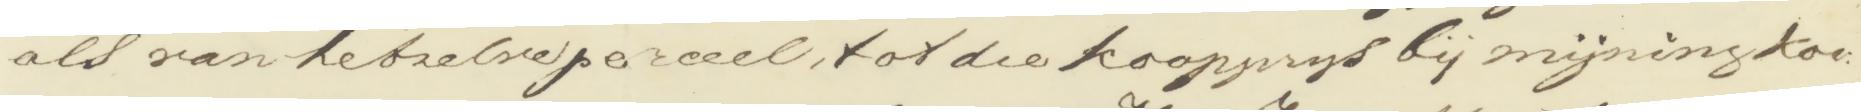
als van hetzelve perceel, tot die koopprys bij mijning koo
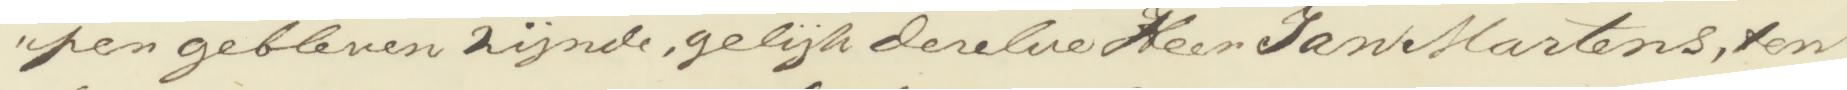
„per gebleven zijnde, gelijk dezelve Heer Jan Martens, ten
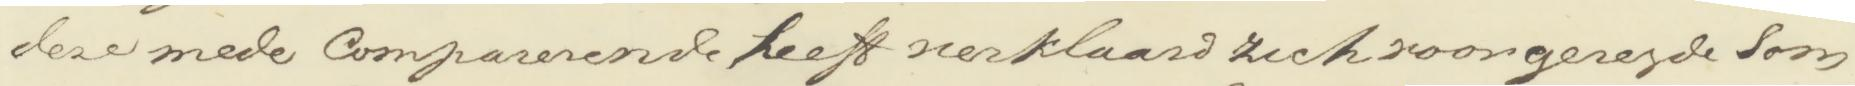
deze mede Comparerende heeft verklaard zich voor gezegde som
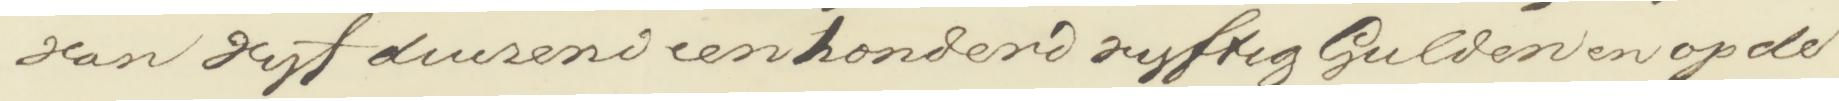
van vyf duizend een honderd vyftig Gulden en op de
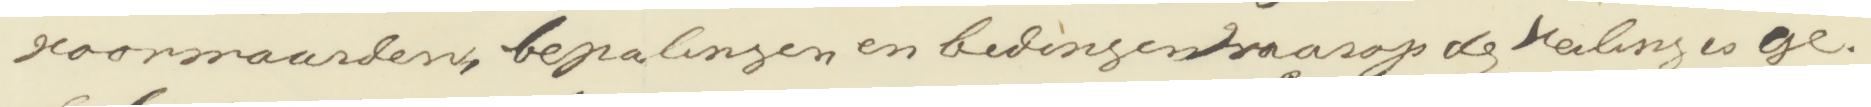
voorwaarden, bepalingen en bedingen vaarop de veiling is ge.
